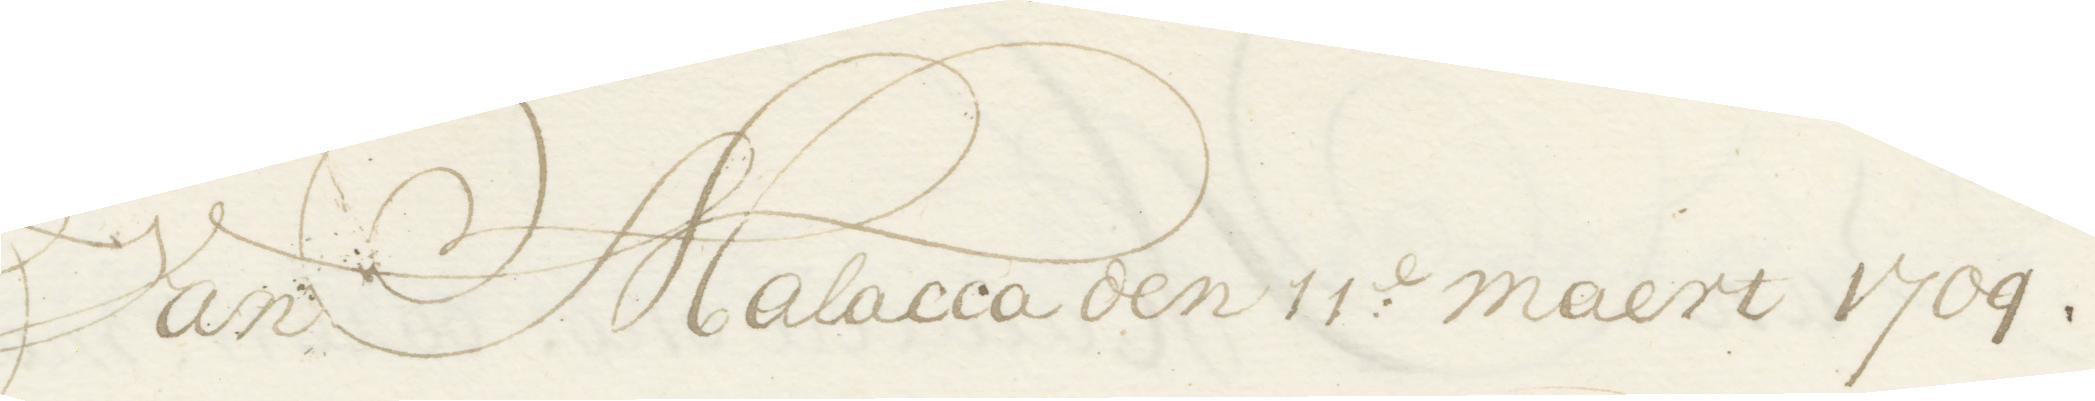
Van Malacca den 11:e maert 1704.
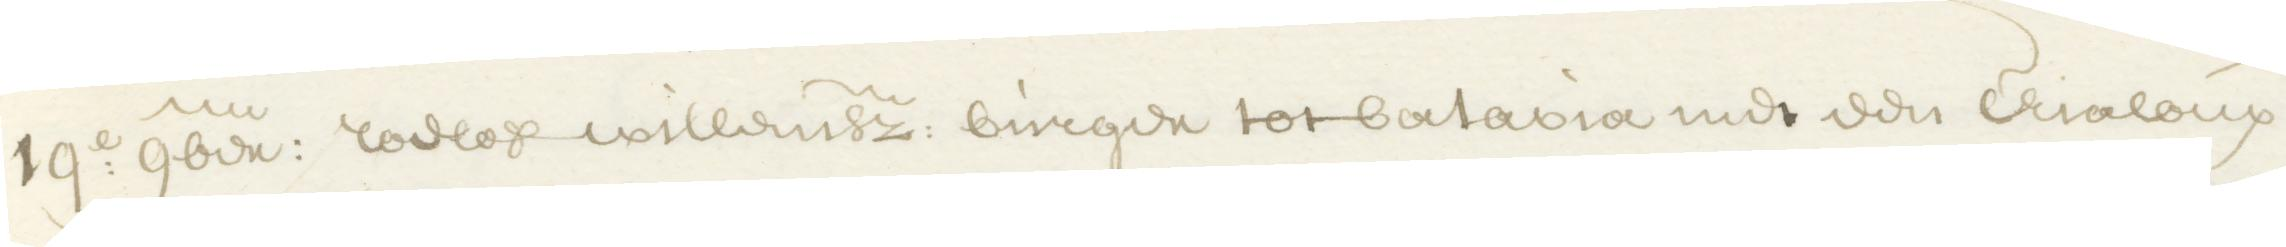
19:e 9ber: roelof willemsz: burger tot batavia met een Chialoup
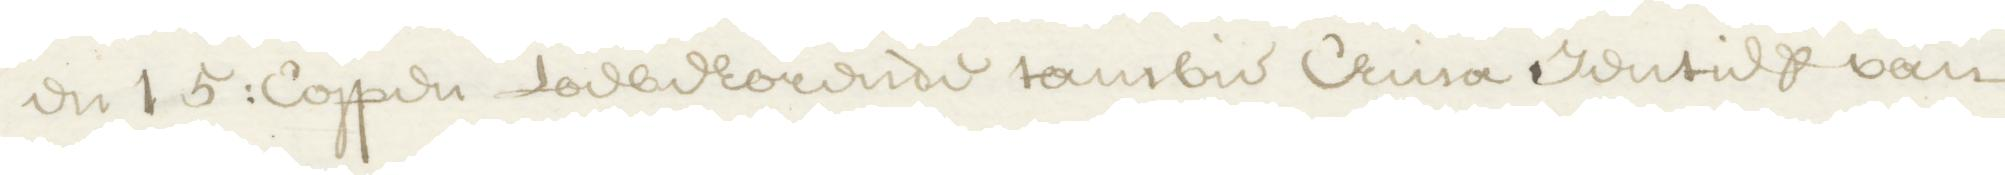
en 15: Coppen toebehorende tambie China Ientief van
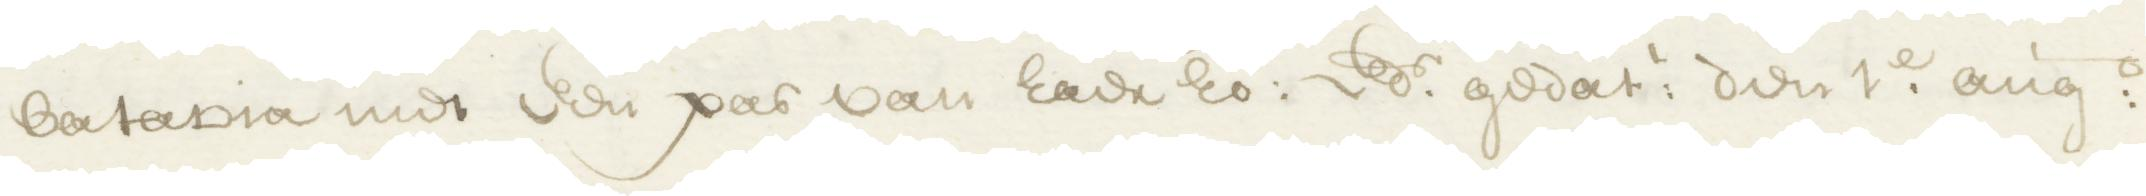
batavia met een pas van haer ho: Ed:s gedat:t den 1.e aug:o
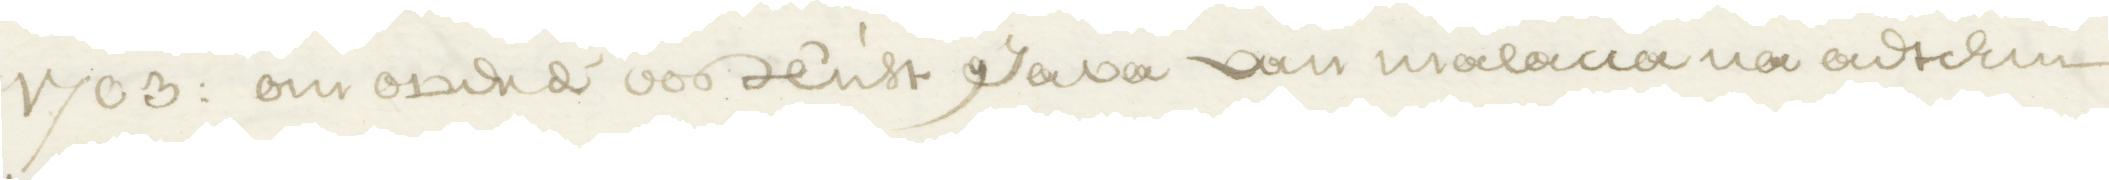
1703: om over de oostcust Java van malacca na aetchin
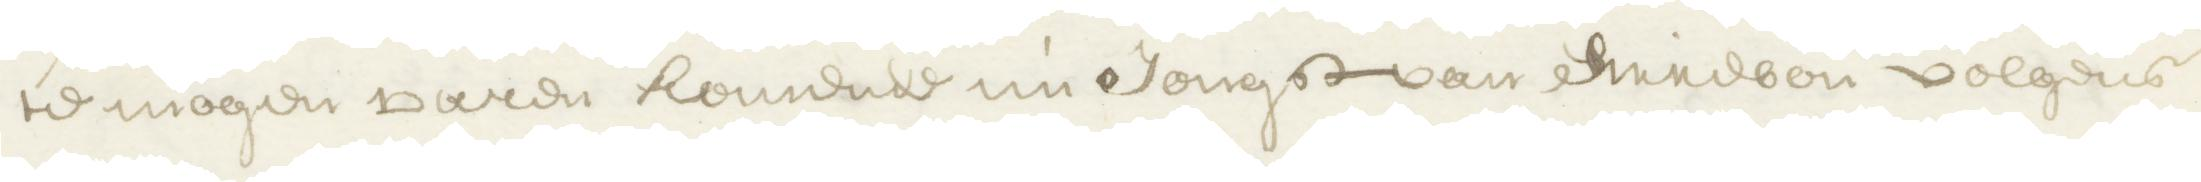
te mogen varen komende nu iongst van chirrebon volgens
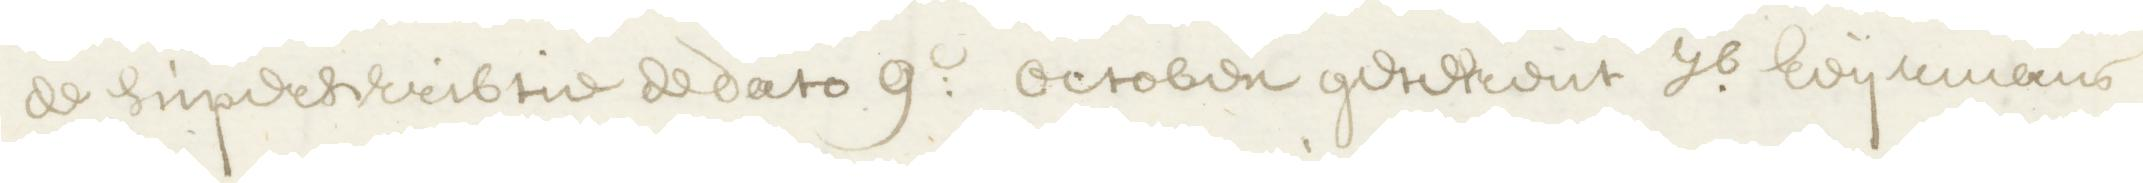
de superschristie de dato 9:e october getekent J.b heijrmans
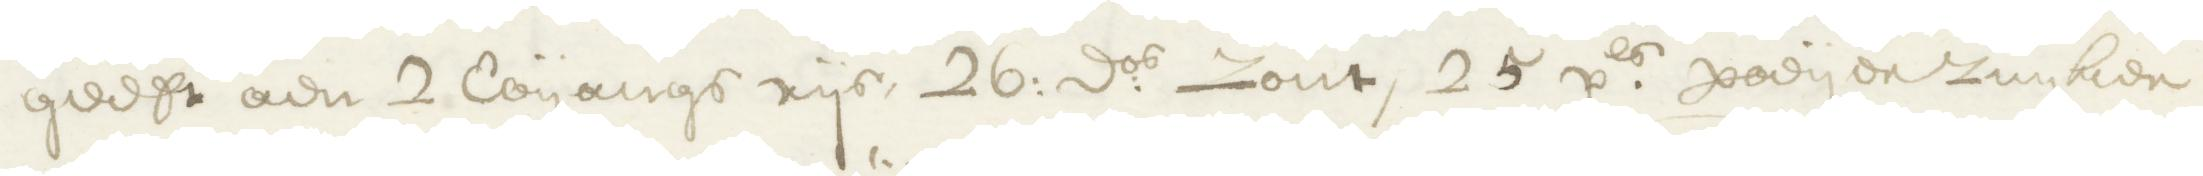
geeft aen 2 Coijangs rijs, 26: d:os zout, 25 p.ls poeijerzuijker
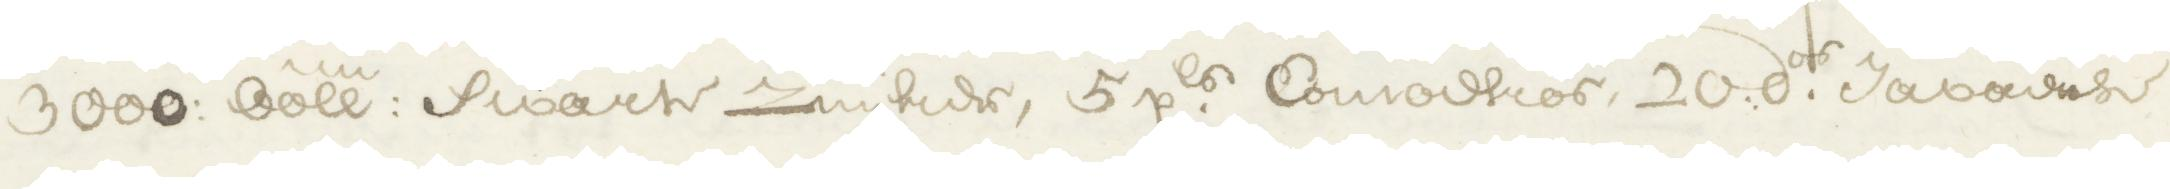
3000: boll: swarte zuijker, 5 p.ls Comoekos 20: d.os Iavaense
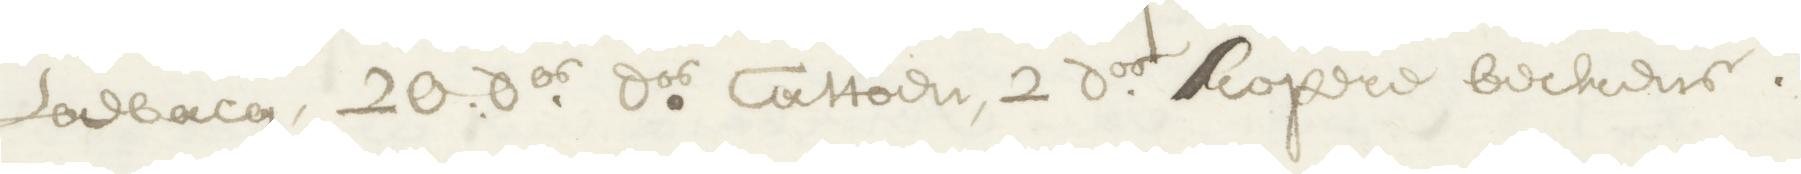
toebacq, 20. d.os d.os Cattoen, 2 d.os kopere beckens.
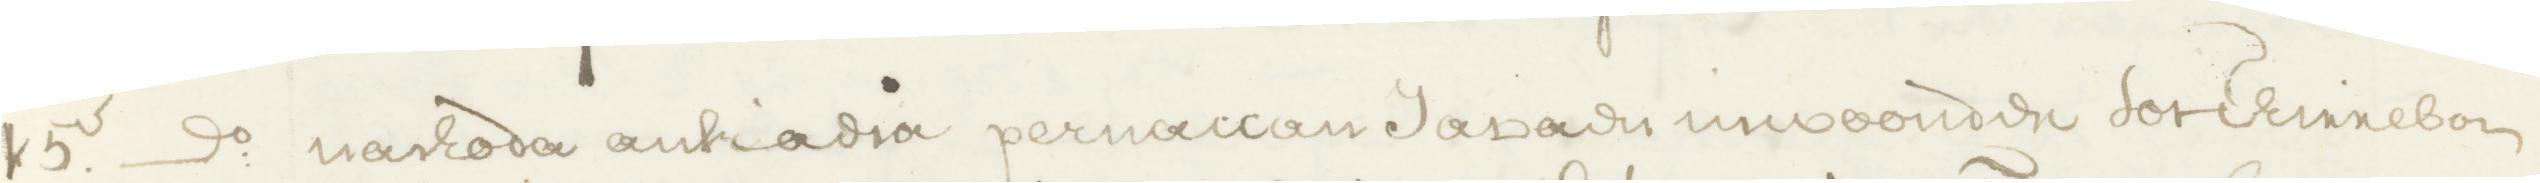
15.e d:o nachoda ankadia pernaccan Iavaen inwoonder tot chirrebon
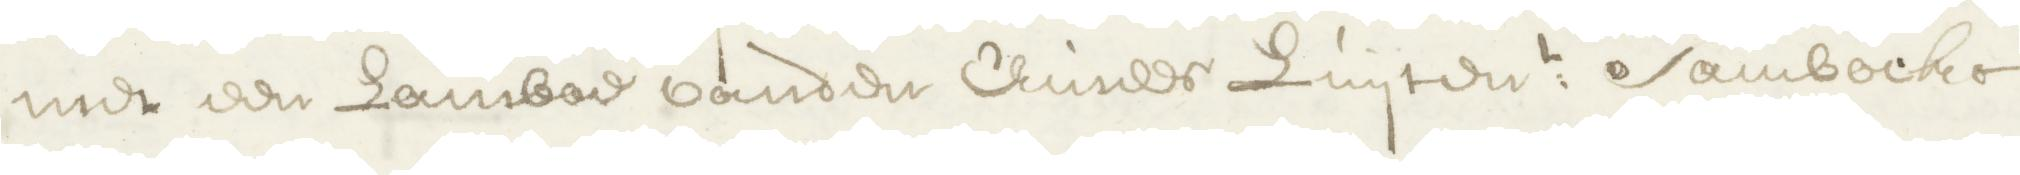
met een Lamboe van den Chinees Luijten:t Tambocko
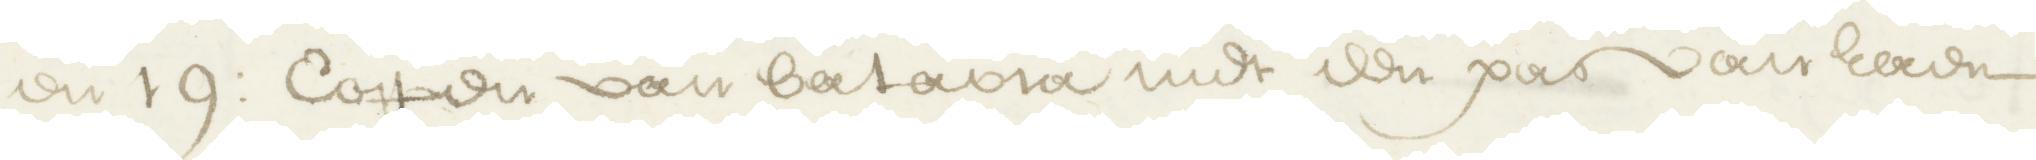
en 19: Coppen van batavia met een pas van heren
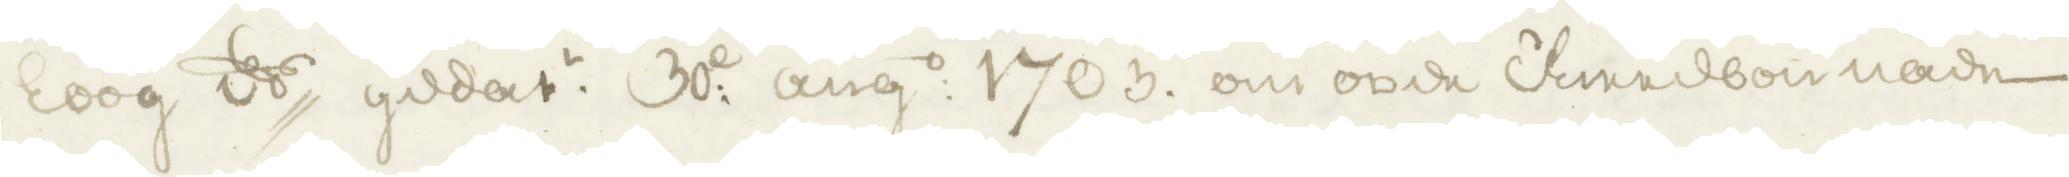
hoog Ed„s gedat:t 30:e aug:o 1703. om over chirrebon naer
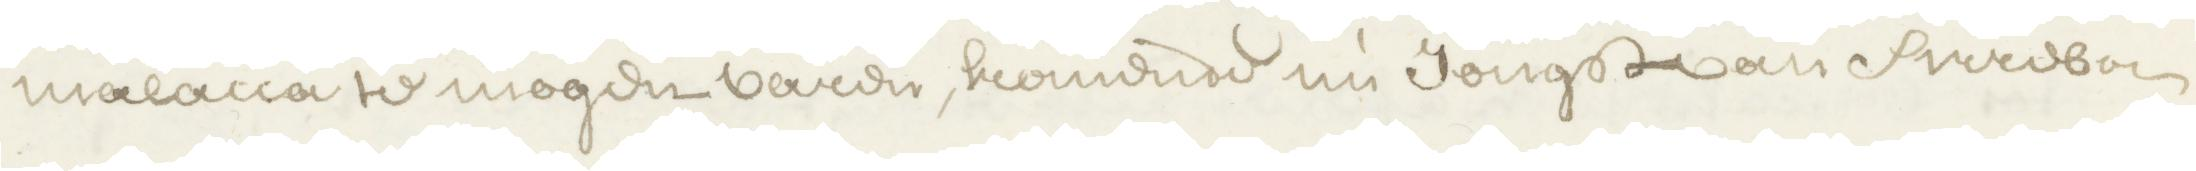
malacca te mogen varen, komende nu Iongst van chirrebon
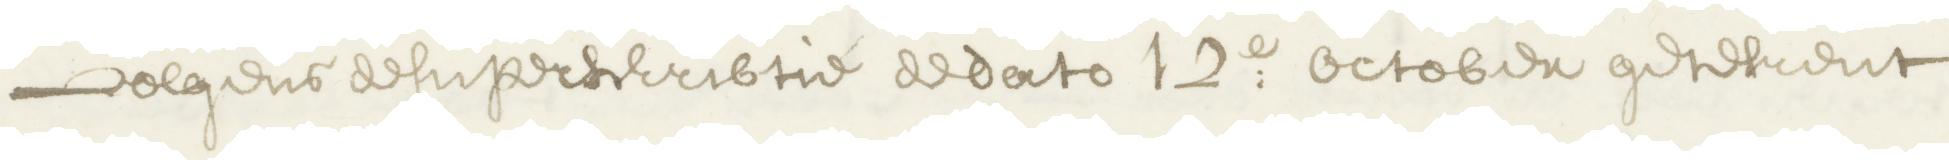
volgens desuperschristie de dato 12:e october getekent
